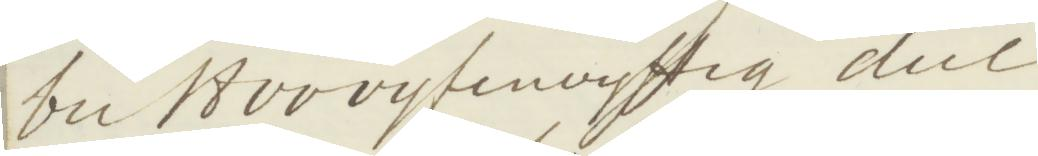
ber 1800 vyfenvyftig deel
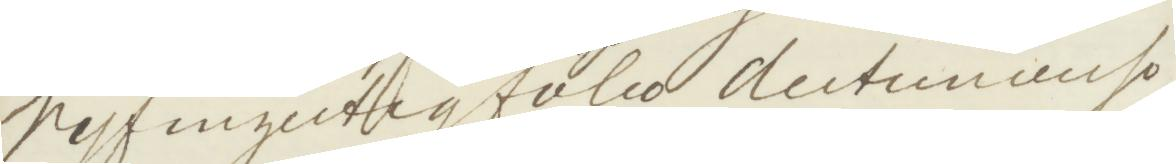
Vyf enzestig folio dertien verso
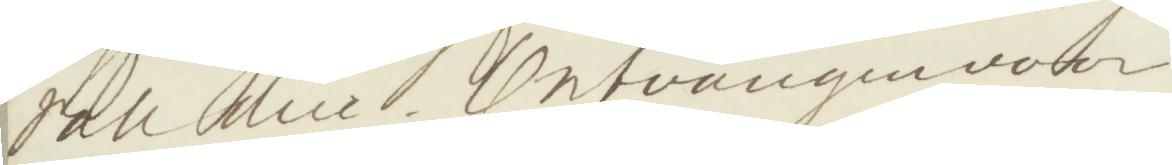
Vak drie Ontvangen voor
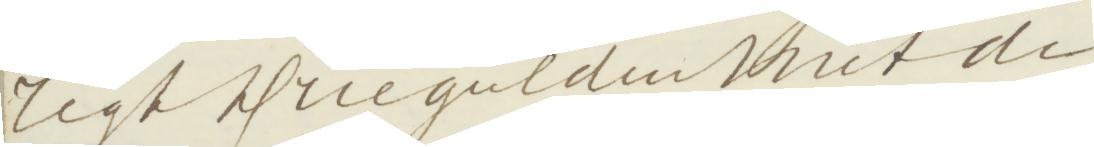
regt Drie gulden met de
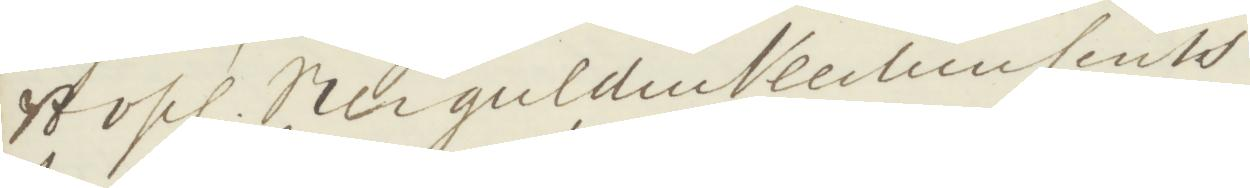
38 opC. Vier gulden Veertien Cents
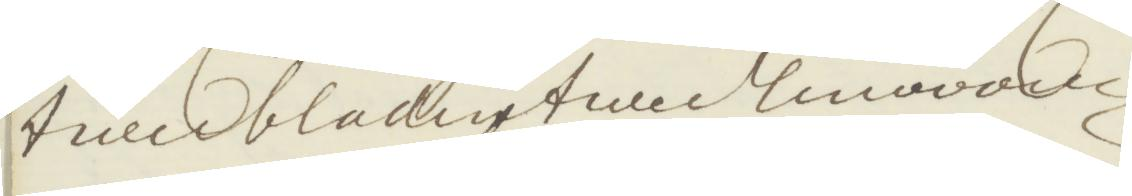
twee bladen twee renvooien
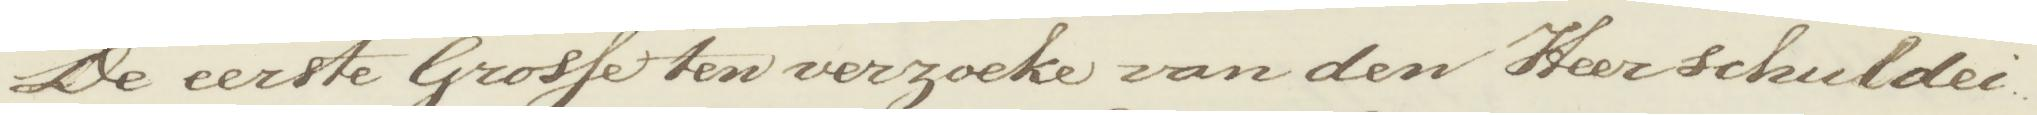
De eerste Grosse ten verzoeke van den Heer schuldei„
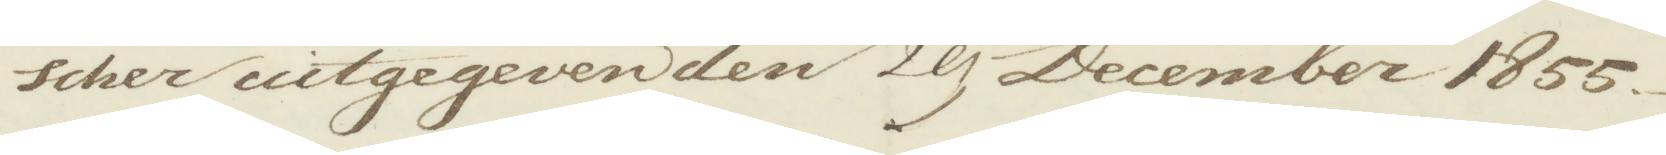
scher uitgegeven den 29 December 1855.
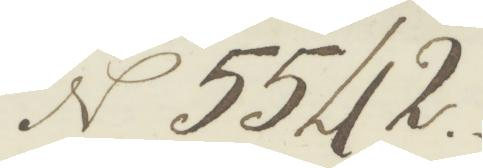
N 5542.
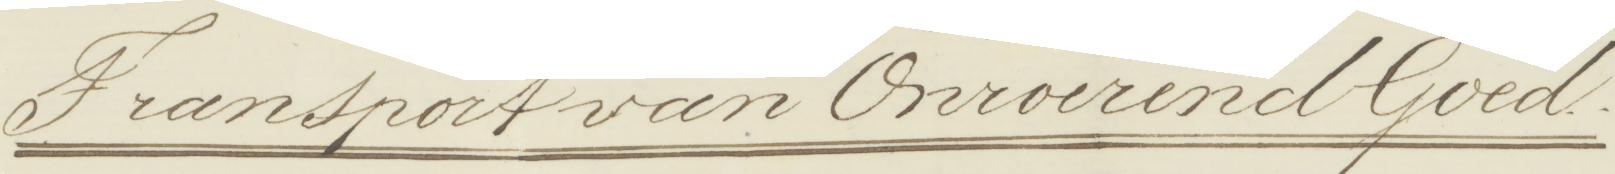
Transport van Onroerend Goed
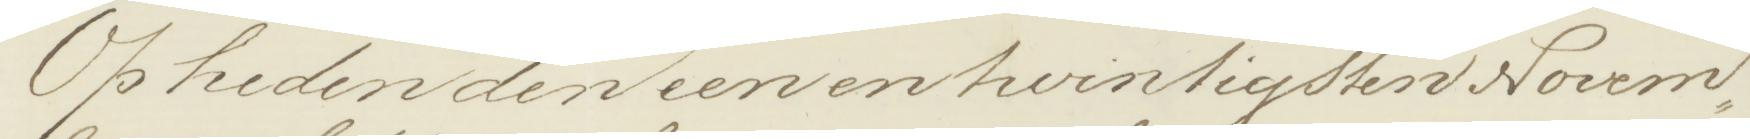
Op heden den een en twintigsten Novem„
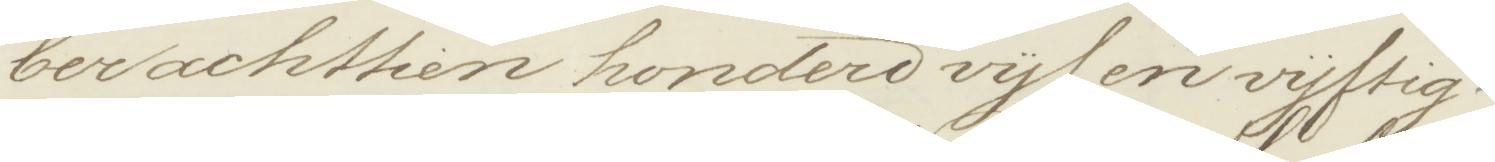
ber achttien honderd vijf en vijftig
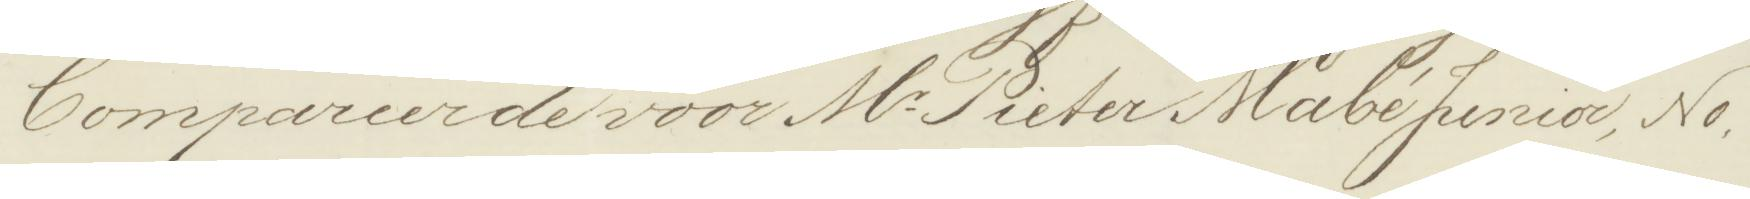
Compareerde voor M-r Pieter Mabé Junior, No,
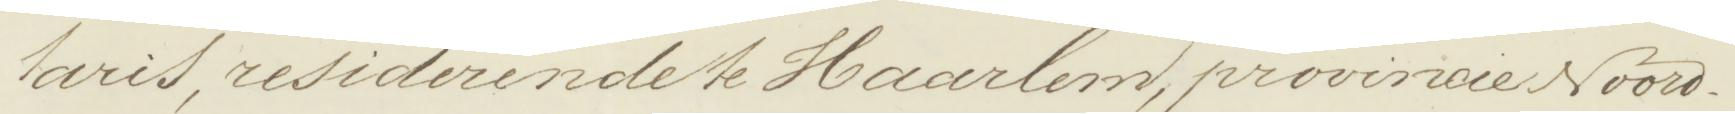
taris residerende te Haarlem, provincie Noord-
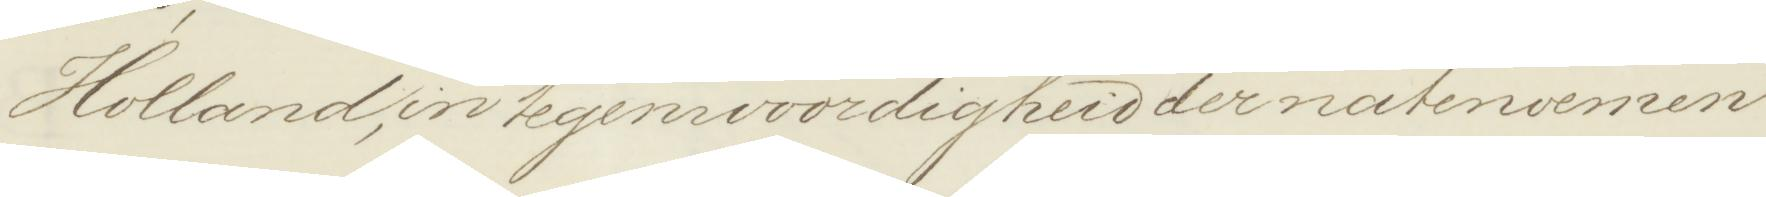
Holland, in tegenwoordigheid der natenoemen
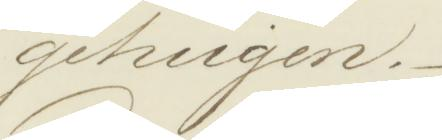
getuigen.-
